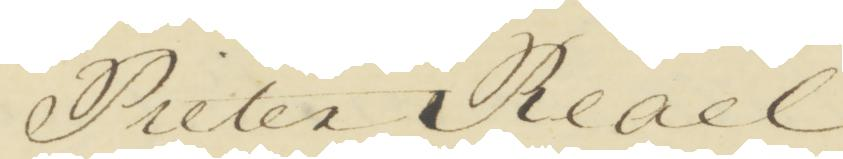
Pieter Reael
